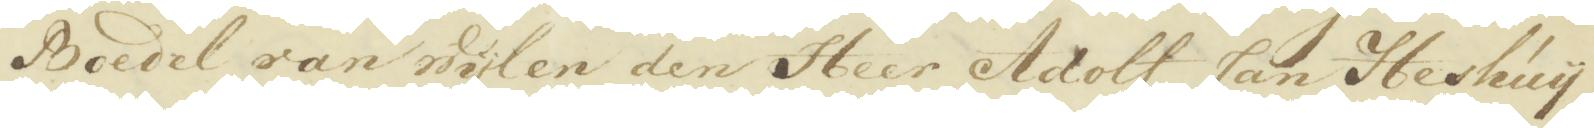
Boedel van wijlen den Heer Adolf Jan Heshuij
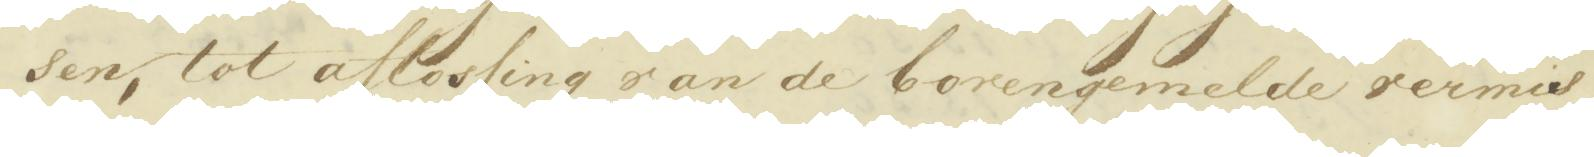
sen, tot aflossing van de bovengemelde vermis
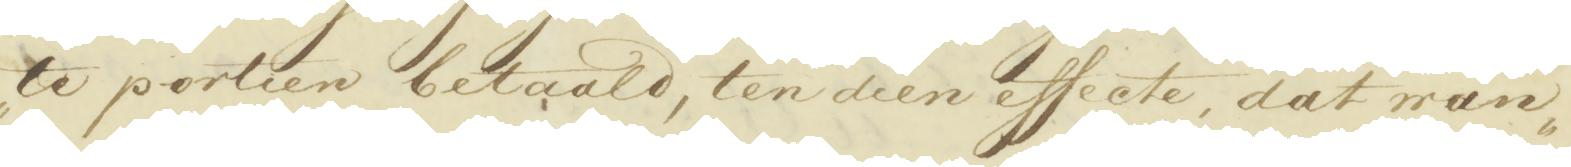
te portien betaald, ten dien effecte, dat wan„
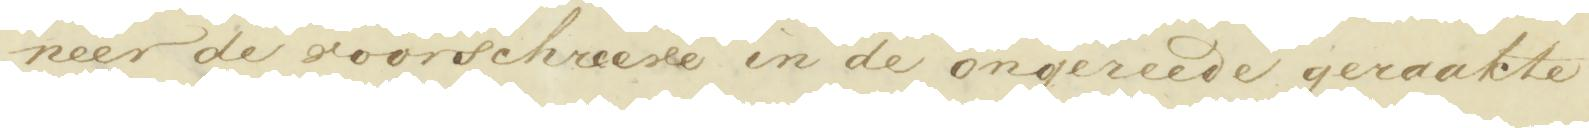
neer de voorschreeve in de ongereede geraakte
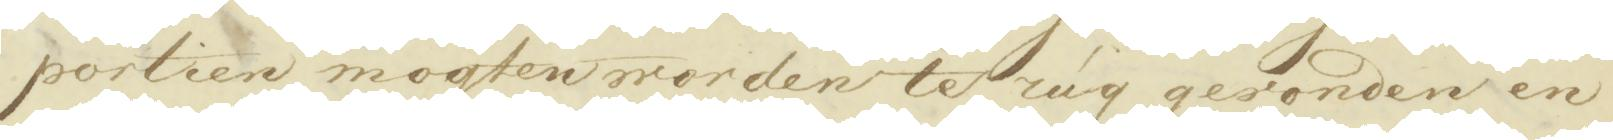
portien mogten worden te rug gevonden en
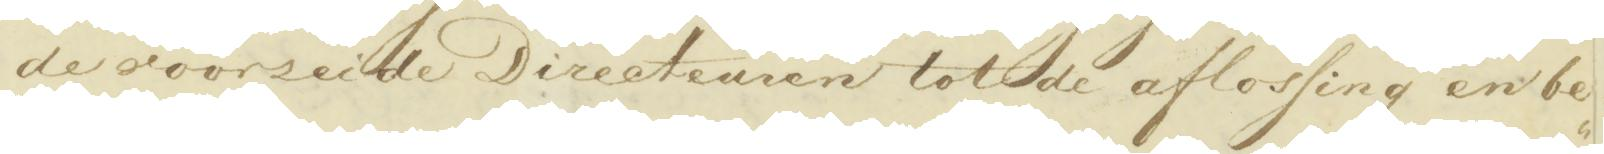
de voorzeide Directeuren tot de aflossing en be„
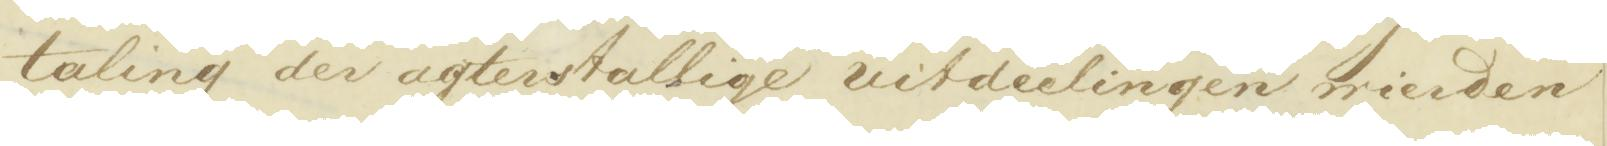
taling der agterstallige uitdeelingen wierden
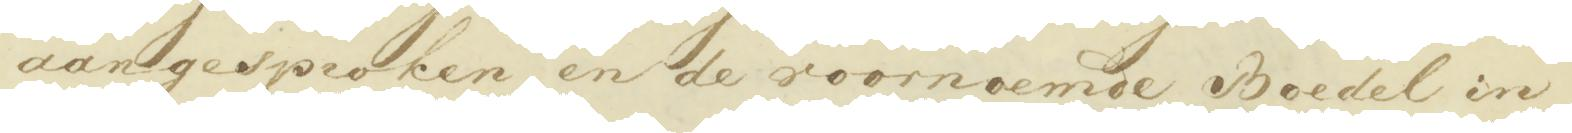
aangespeeken en de voornoemde Boedel in
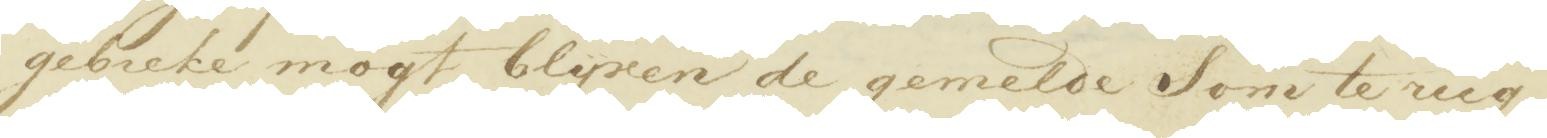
gebreke mogt blijven de gemelde som te rug
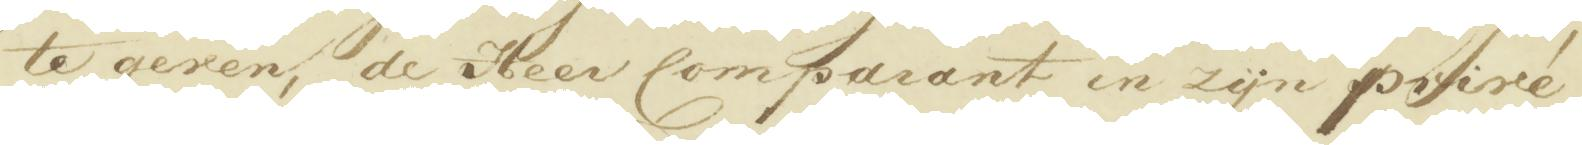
te geven, de Heer Comparant in zijn privé
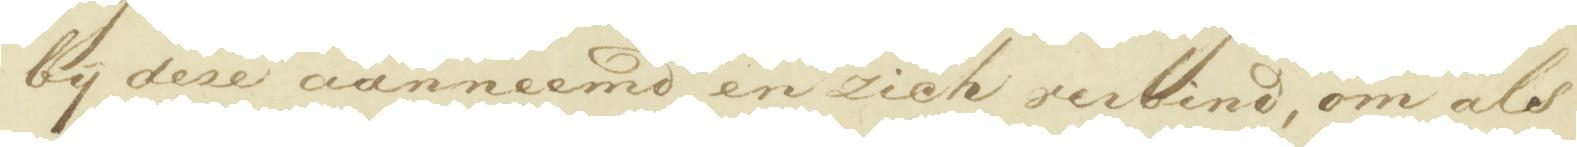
bij deze aanneemd en zich verbind, om als
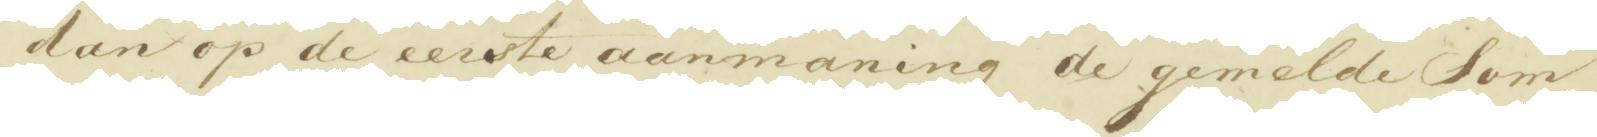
dan op de eerste aanmaning de gemelde Som
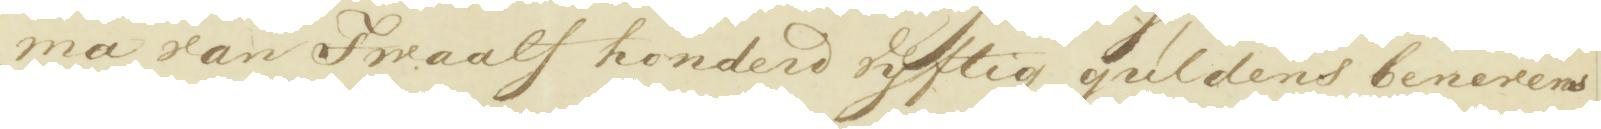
ma van Twaalf honderd vijftig guldens benevens
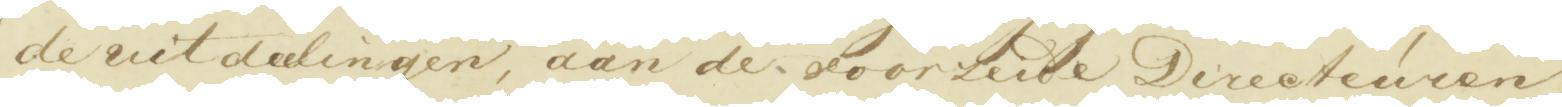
de uit deelingen, aan de voorzeide Directeuren
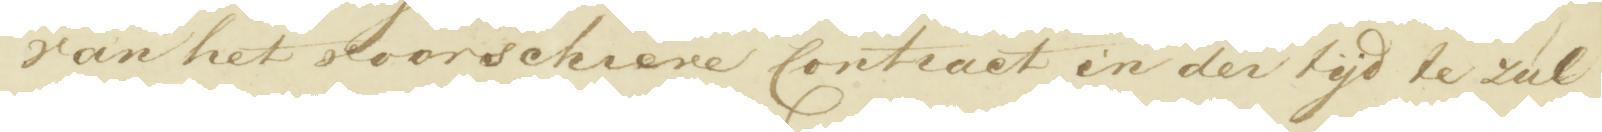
van het voorschreve Contract in der tijd te zul„
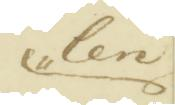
„len
